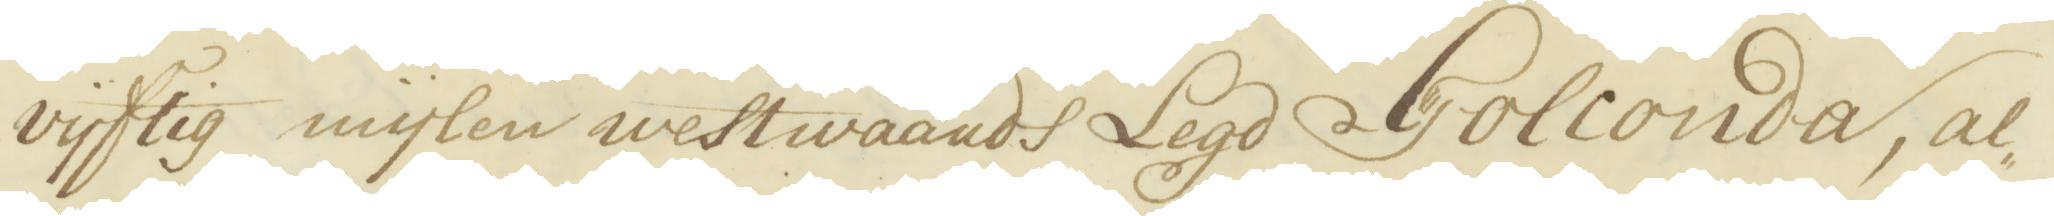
vijftig mijlen westwaards Legd Golconda, al„
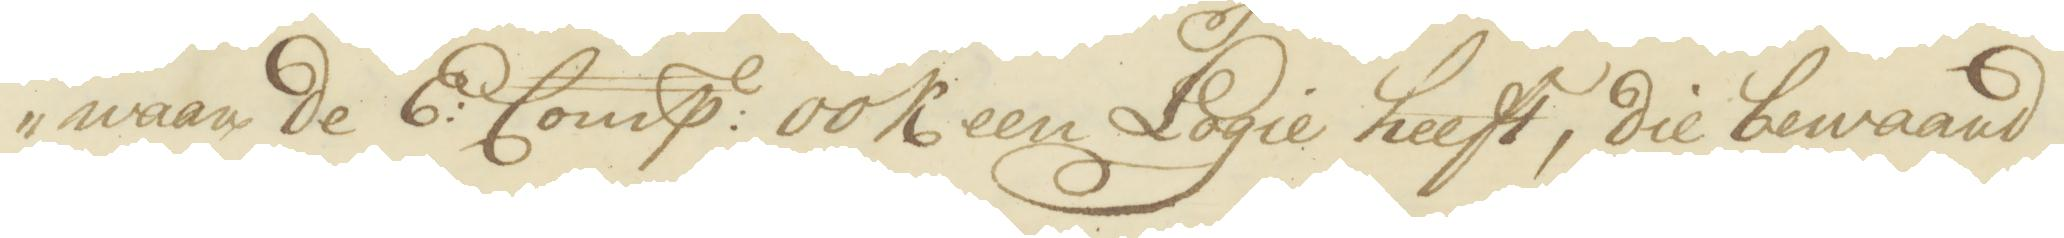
„waar de E: Comp:e ook een Logie heeft, die bewaard
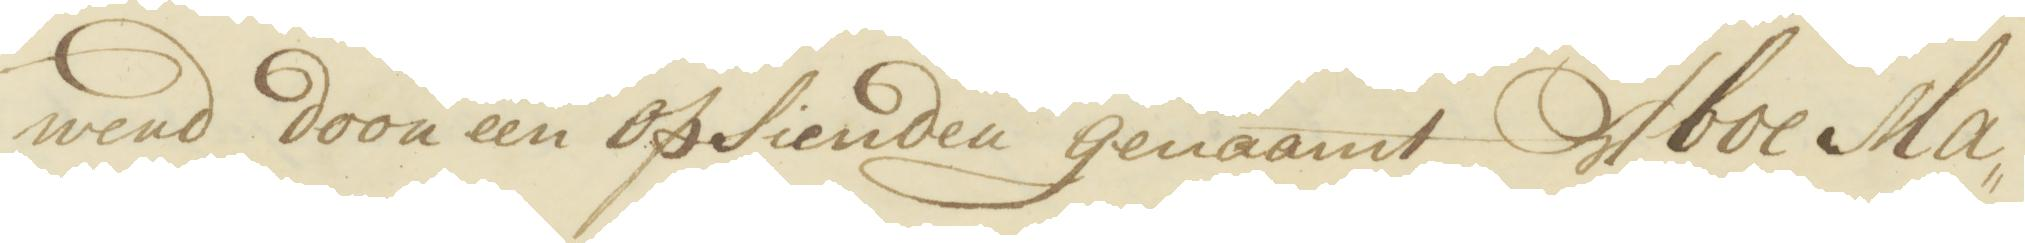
werd door een opsiender genaamt Aboe Ma„
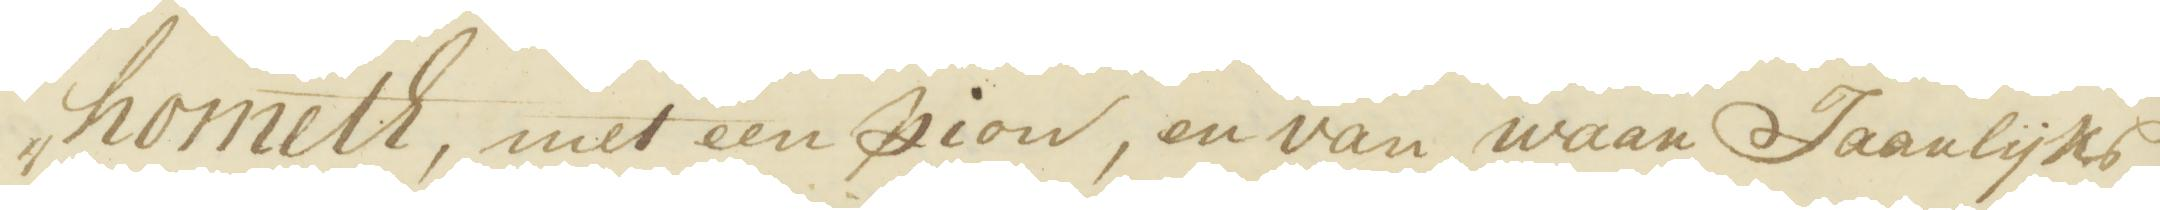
„hometh, met een pion, en van waar Iaarlijks
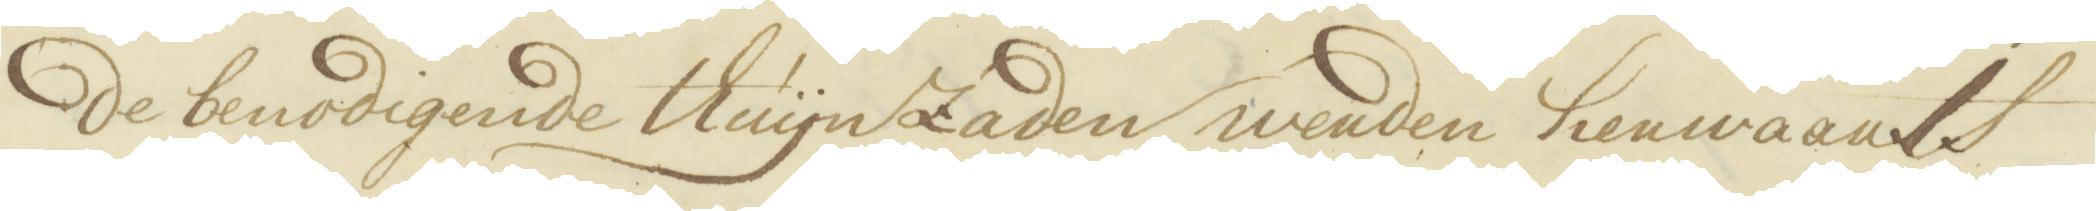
de benodigende thuijn zaden werden herwaarts
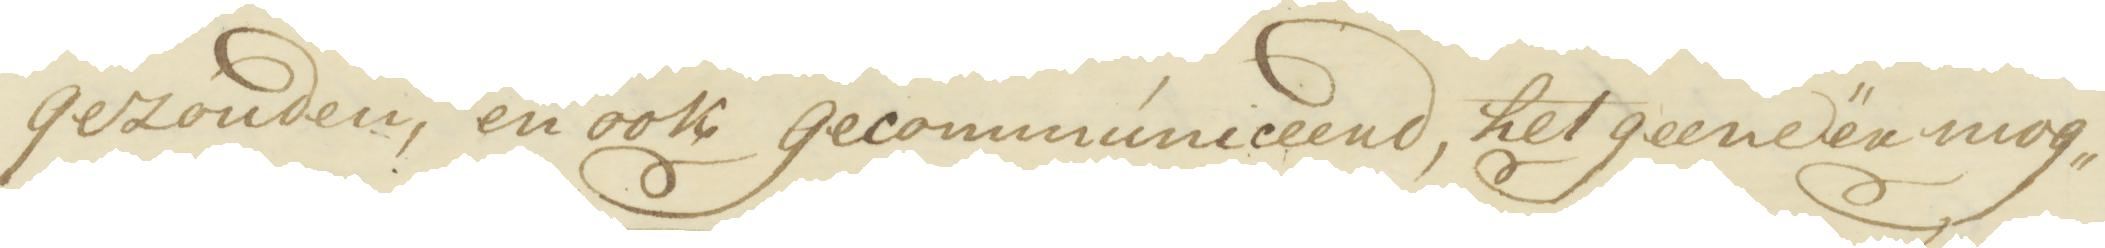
gezonden; en ook gecommuniceerd, het geene "er mog„
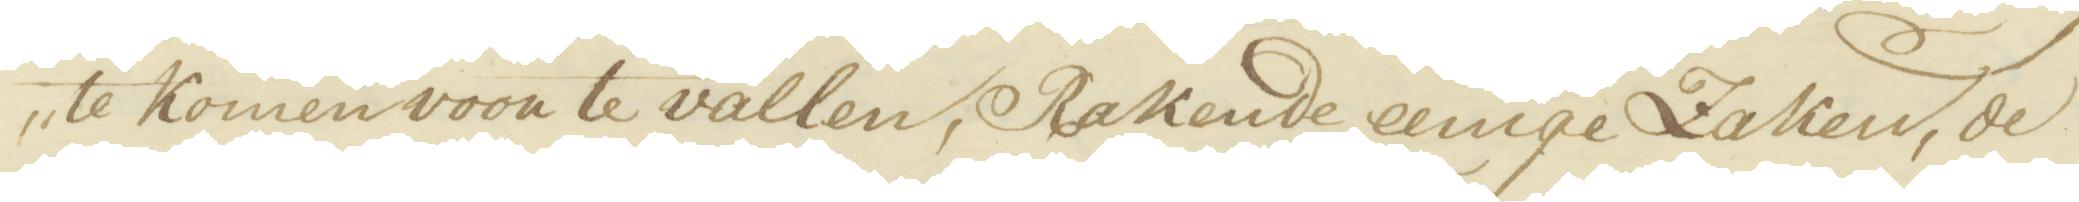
„te komen voor te vallen, Rakende eenige Zaken, de
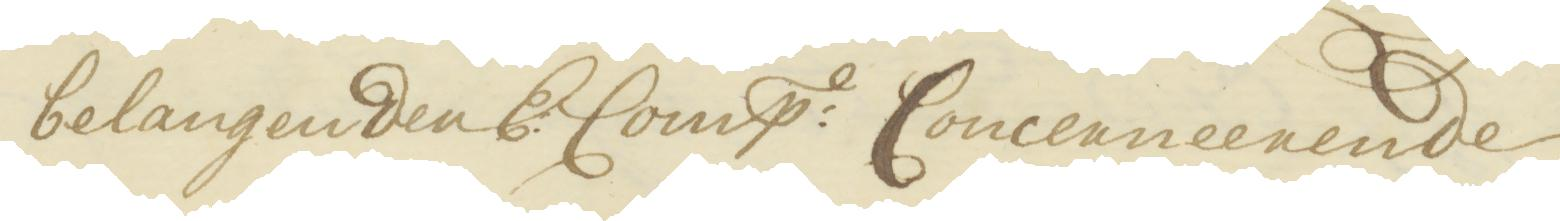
belangen der E: Comp:e Concerneerende
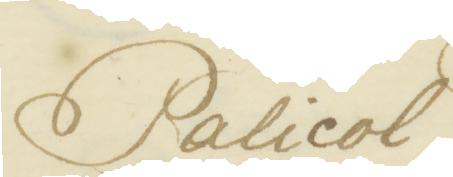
Palicol
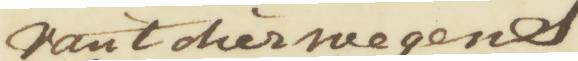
van 't dier wegens
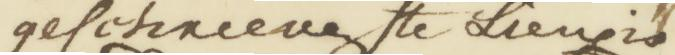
geschreeven te Sien is
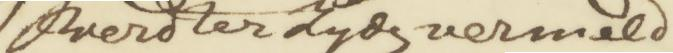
werd ter Zyde vermeld
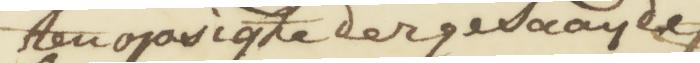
ten opsigte der gesaayde
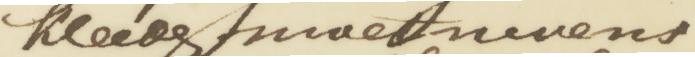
kleeden moet nevens
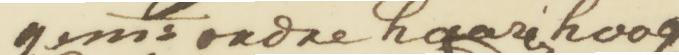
gem: ordre haar hoog
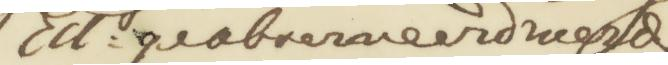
Ed=s geabreweerd werden
